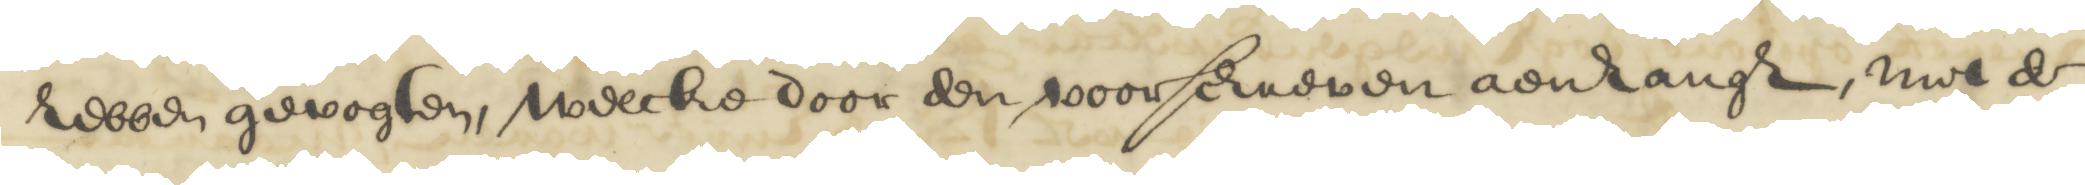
hebben gevogten, welcke door den voorschreven aenhangh, met de
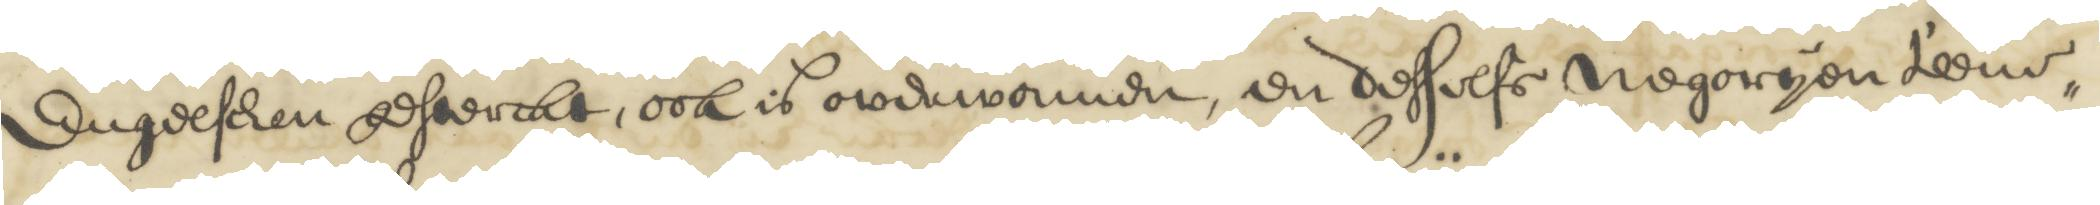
Engelschen gesterckt, ook is overwonnen, en desselfs negorijen t'eene„
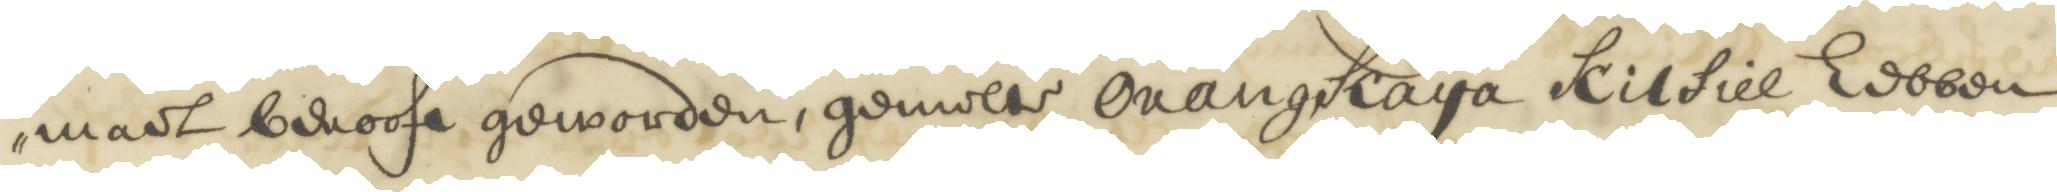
„mael berooft geworden, gemelte Orangkaija kitsiel hebben
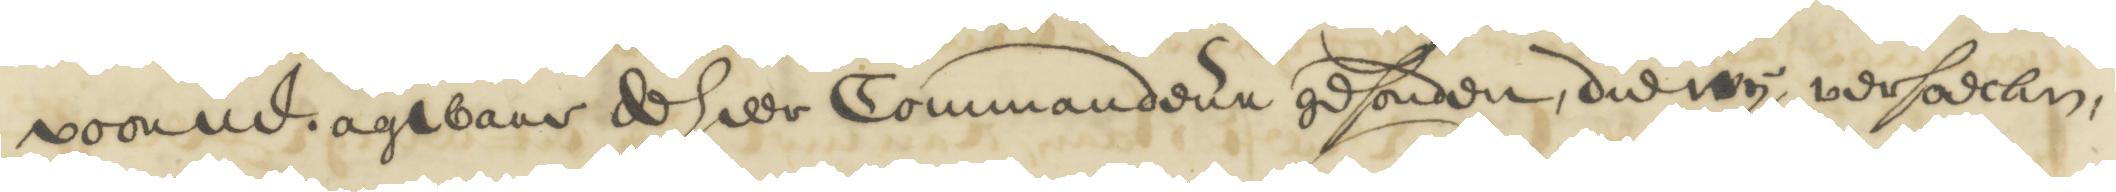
voor uE. agtbare de heer Commandeur gesonden, die wij versoecken,
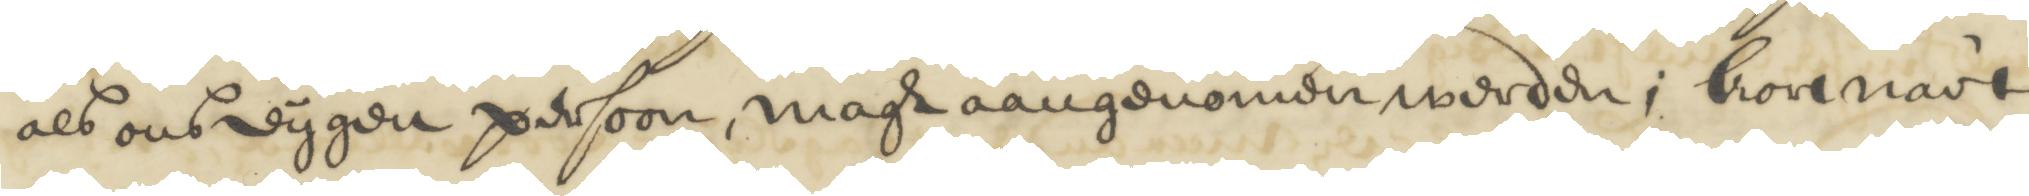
als ons eijgen persoon, magh aangenomen werden; kort nae't
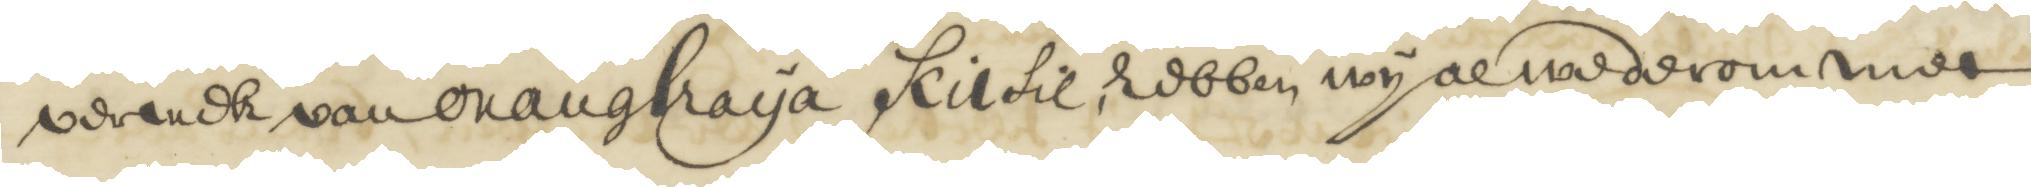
vertrek van orangkaija kitsil, hebben wij al wederom met
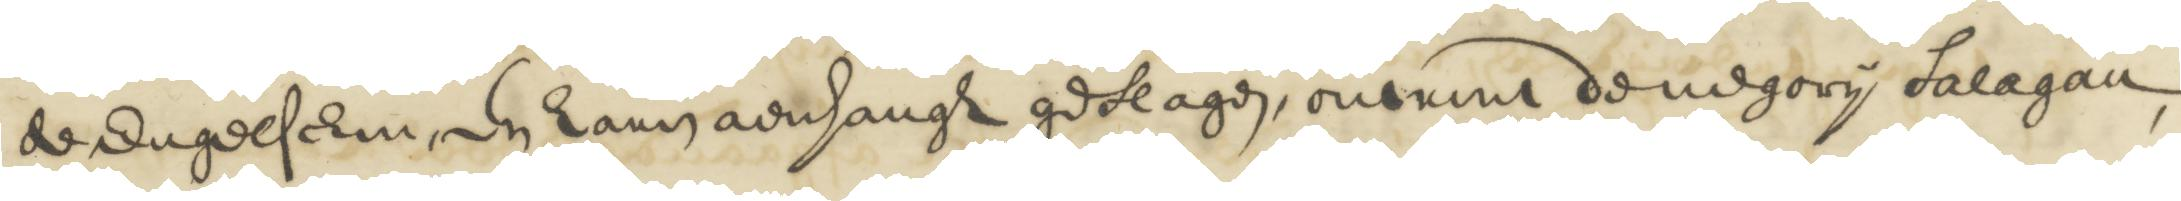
de Engelschen, en haren aenhangh geslagen, ontrent de negorij salagan,
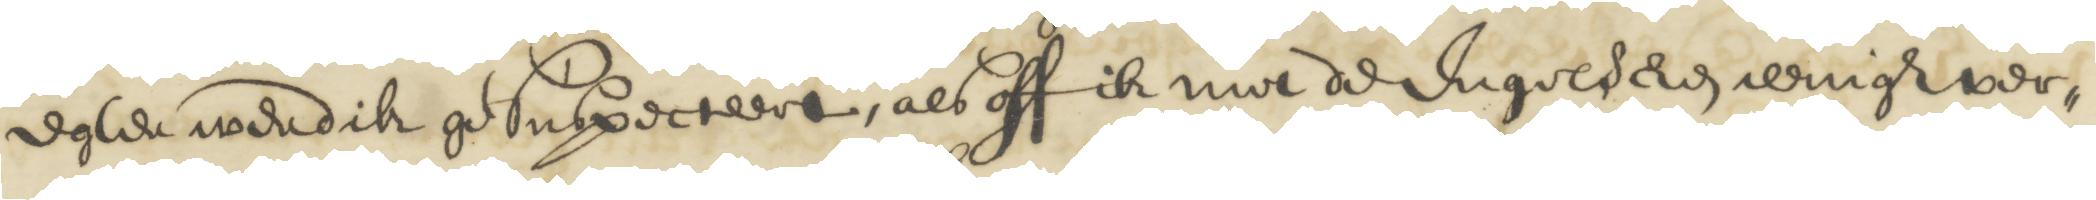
egter werd ik gesuspecteert, als off ik met de Engelschen eenigh ver„
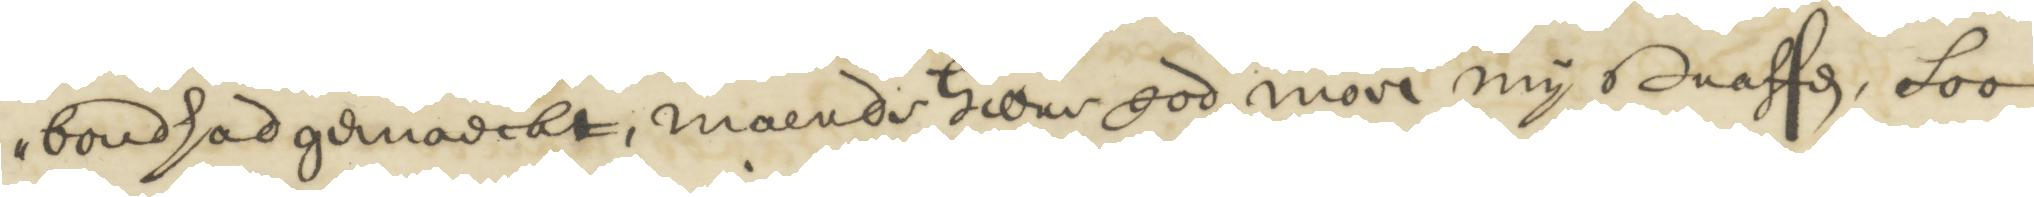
„bond had gemaeckt, maer de heere god moet mij straffen, soo
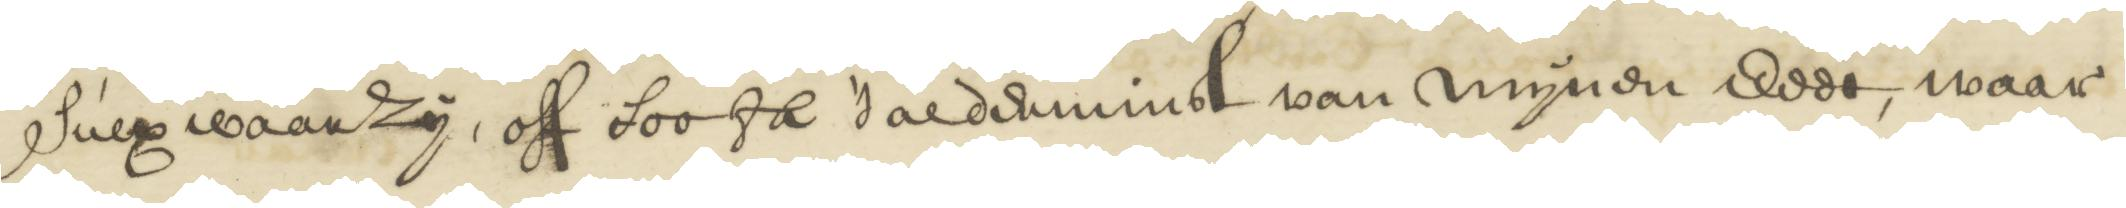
sulx waar zij, off soo Ik 't alderminst van mijnen Eedt, waar
